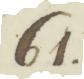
61.
